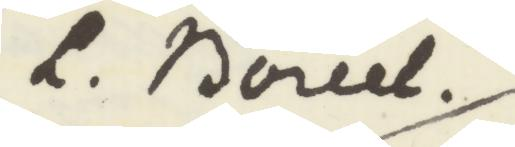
L. Boreel.
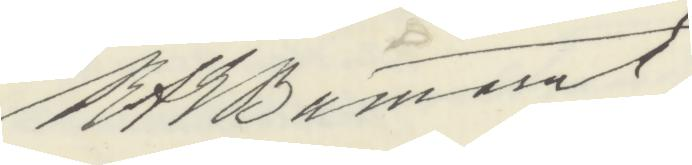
RAEBarnaart
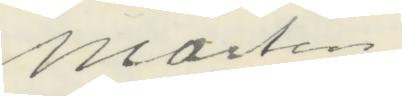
marten
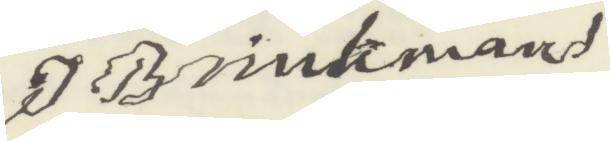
I Brinkmans
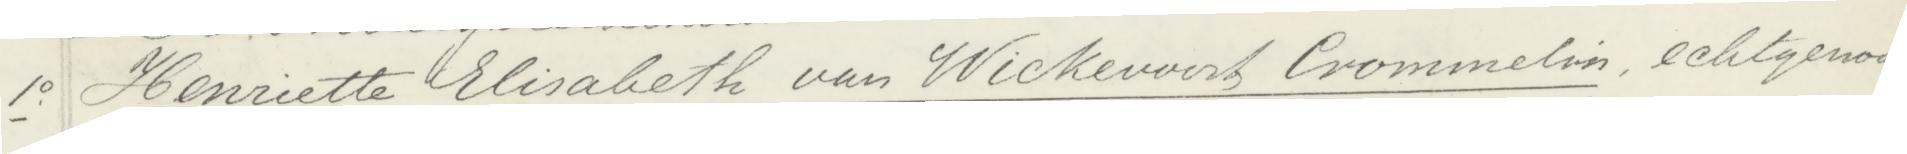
1:o Henriette Elisabeth van Wickevoort Crommelin, echtgenoo
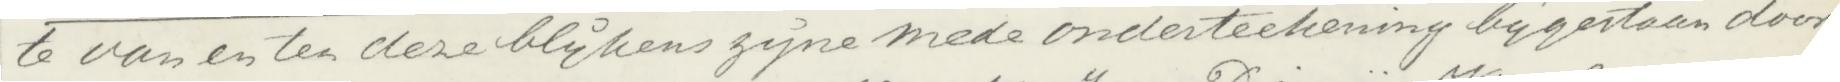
te van en ten deze blijkens zijne mede onderteekening bijgestaan door
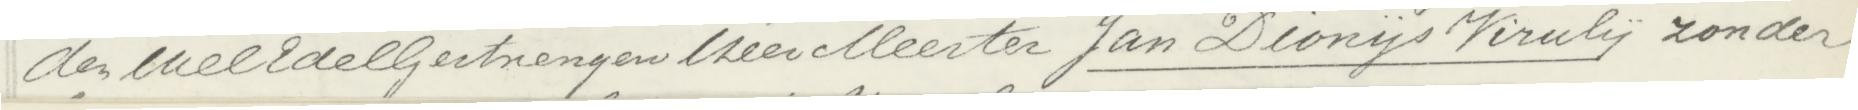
den wel EdelGestrengen Heer Meester Jan Dionijs Virulij zonder
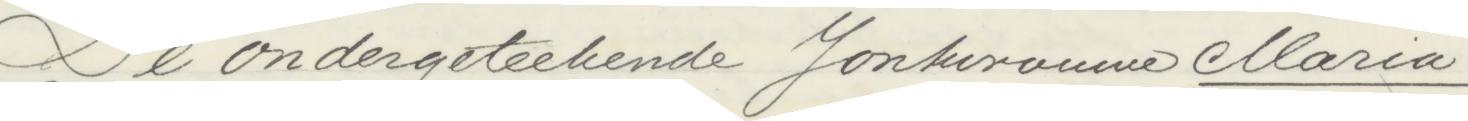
De ondergeteekende Jonkvrouwe Maria
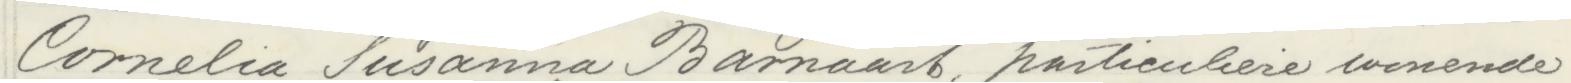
Cornelia Susanna Barnaart, particuliere wonende
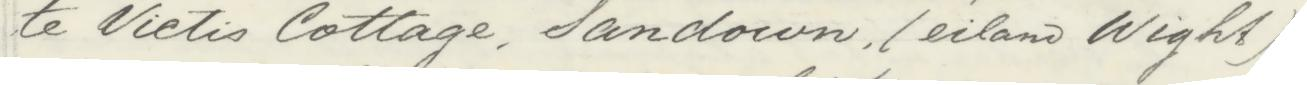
te Victis Cottage, Sandown, ( eiland Wight )
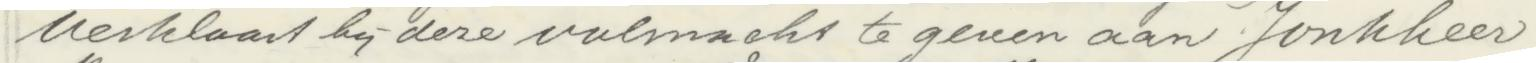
verklaart bij deze volmacht te geven aan Jonkheer
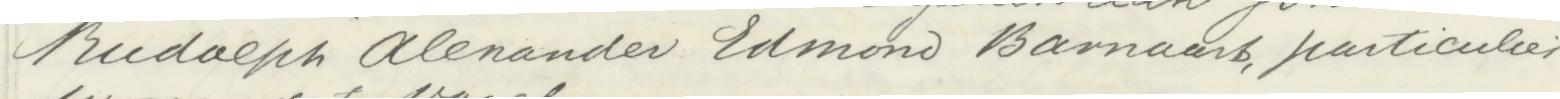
Rudolph Alexander Edmond Barnaart, particulier
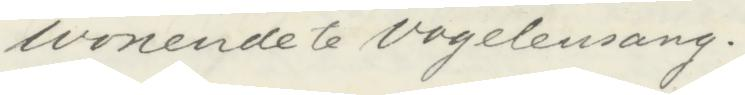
wonende te Vogelensang.
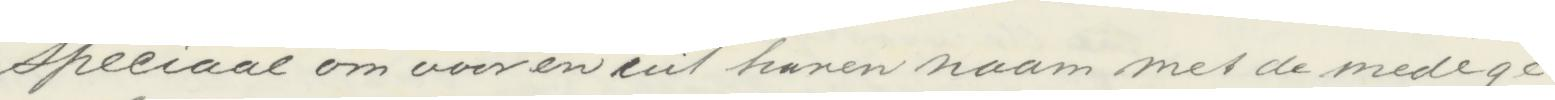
Speciaal om voor en uit haren naam met de mede ge
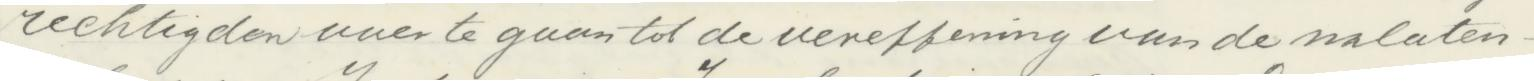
rechtigden over te gaan tot de vereffening van de nalaten
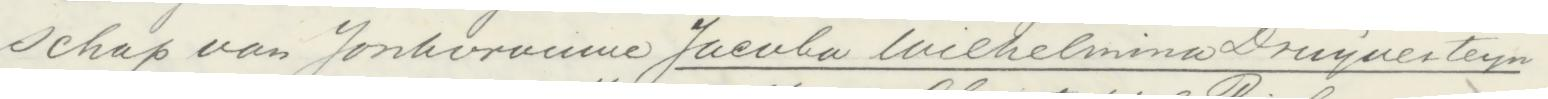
schap van Jonkvrouwe Jacoba Wilhelmina Druijvesteyn
